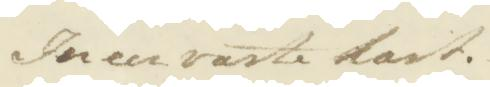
In en vaste kast.
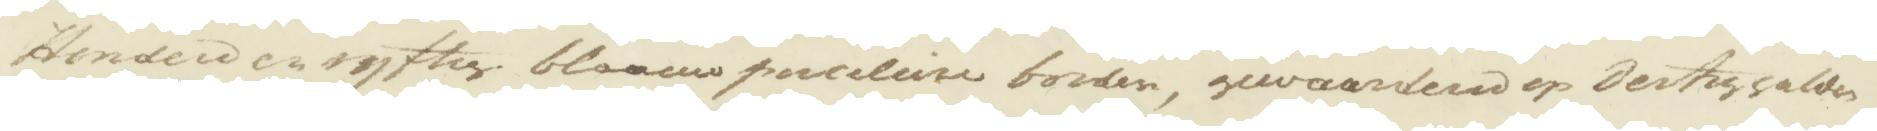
Honderd en vyftig blaauw porceleine borden, gewaardeerd op Dertig gulden
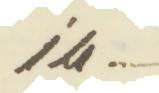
14 „ -
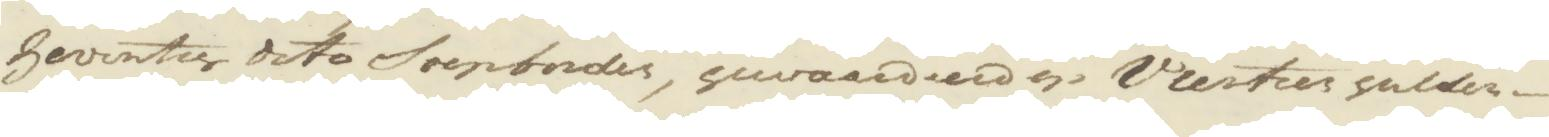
Zeventig dito Soepborden, gewaardeerd op Veertien gulden
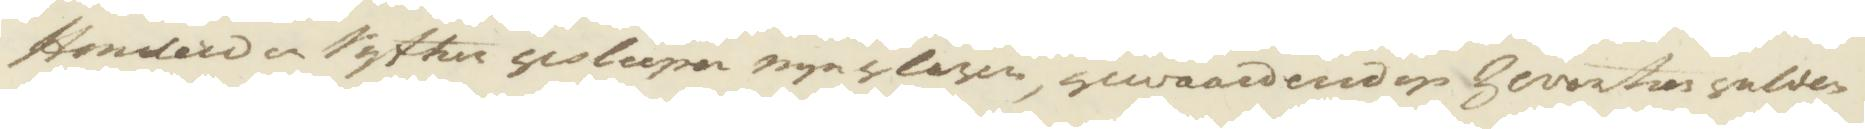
Honderd en Vyftig gesleepen wynglazen, gewaardeerd op Zeventien gulden
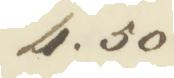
4. 50
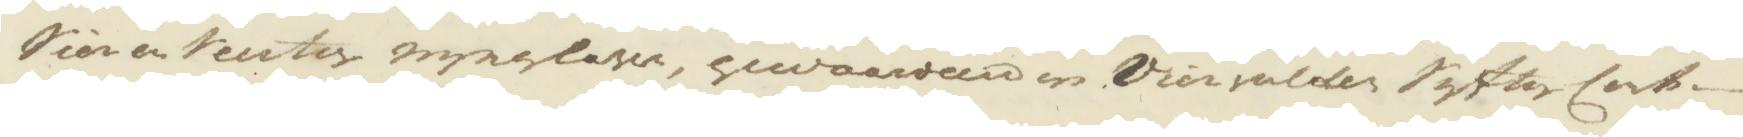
Vier en Veertig wynglazen, gewaardeerd en Vier gulden Vyftig Cents.
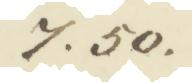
7. 50.
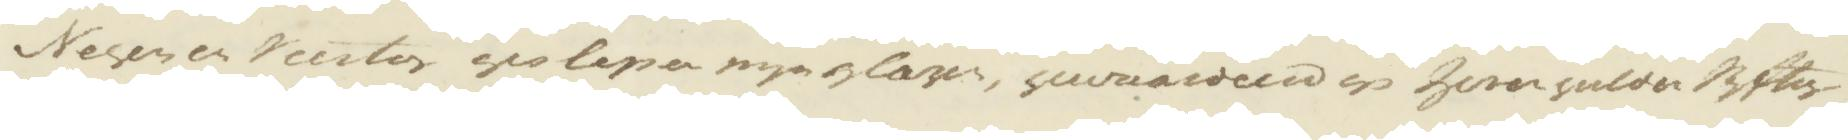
Negen en Veertig geslepen wynglazen, gewaardeerd op Zeven gulden Vyftig
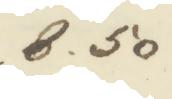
8. 50
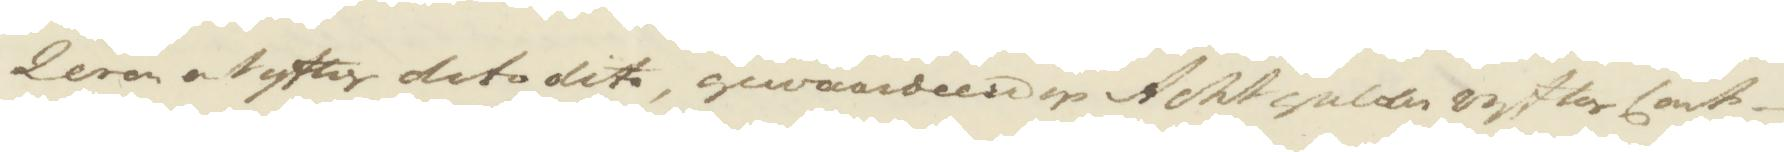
Zeven en Vyftig dito dito, gewaardeerd op Acht gulden vyftig Cents-
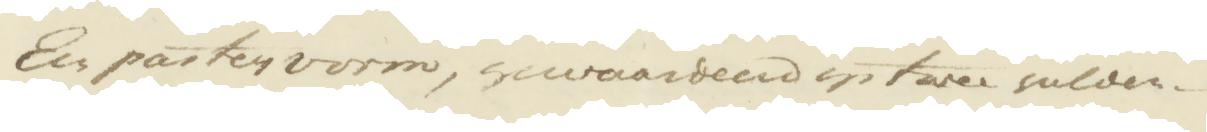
En pasteyvorm, gewaardeerd op twee gulden.
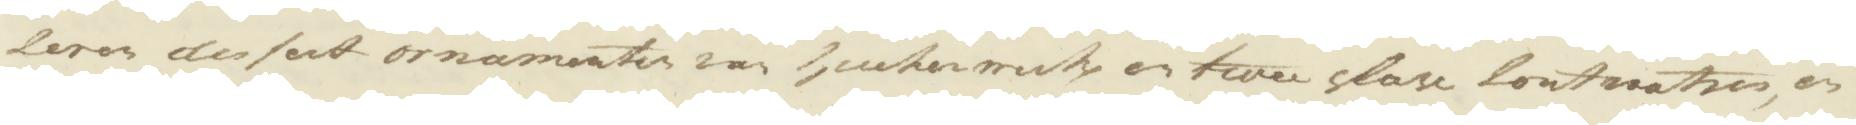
zeven dessert ornamenten van Zuikerwerk en twee glase Zoutvaatjes, en
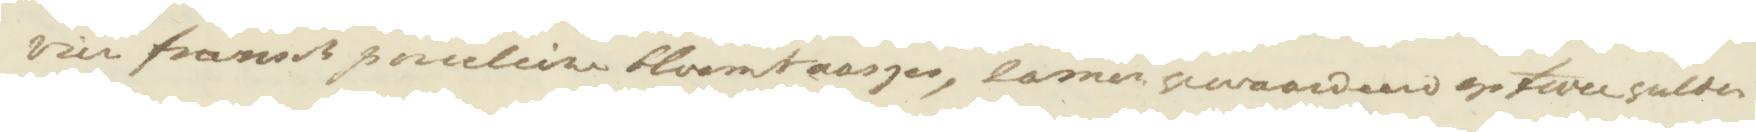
vier fransch porceleine bloemvaasjes, zamen gewaardeerd op twee gulden
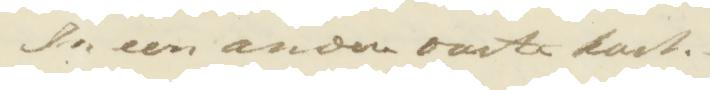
In een andere vaste kast.
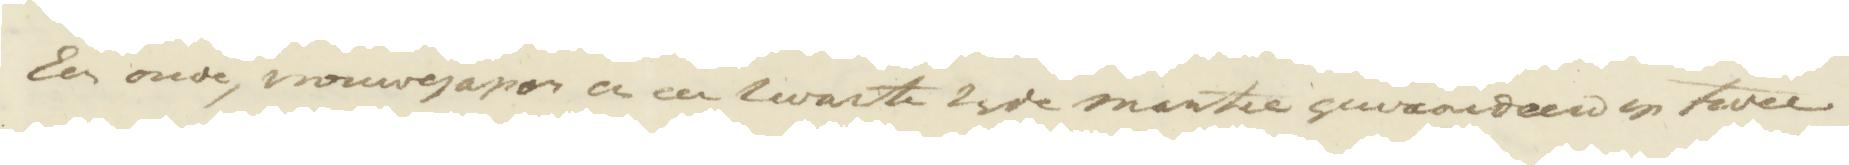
Een oude, vrouwejapon en een zwarte zyde mantje gewaardeerd op twee
